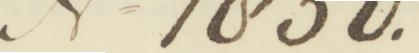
N=o 1850.
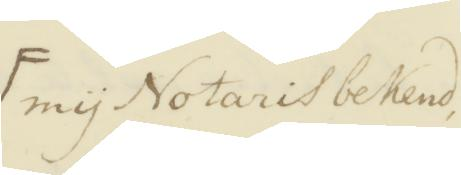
F mij Notaris bekend,
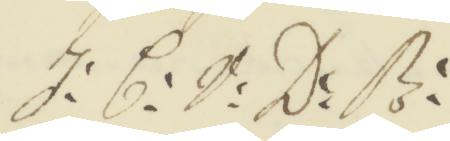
I: C: V: D: B:
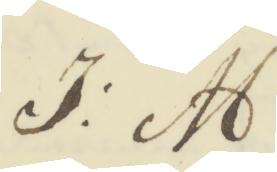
I: M
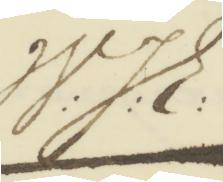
W: J: H
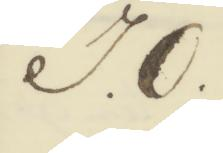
I. O.
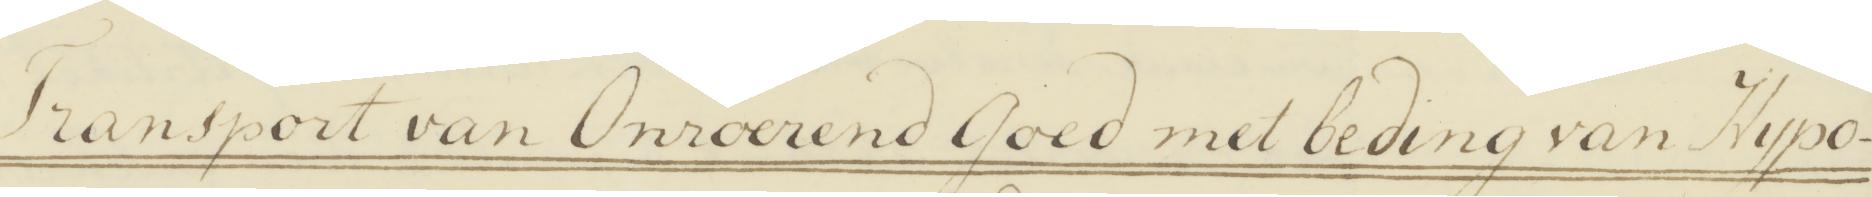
Transport van Onroerend Goed met beding van Hypo-
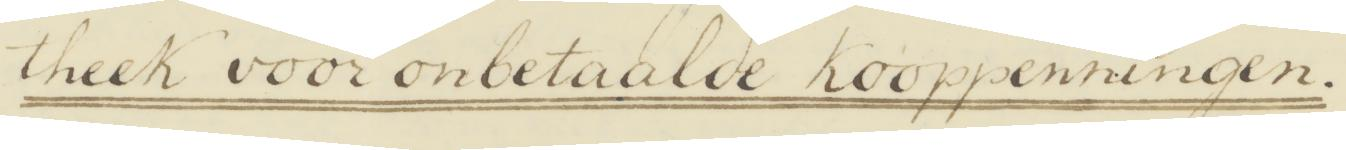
theek voor onbetaalde kooppenningen.
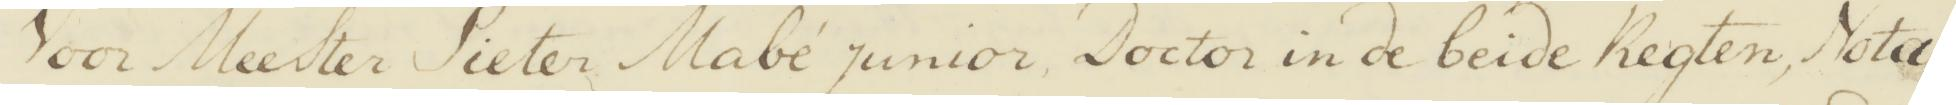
Voor Meester Pieter Mabé junior, Doctor in de beide Regten, Nota-
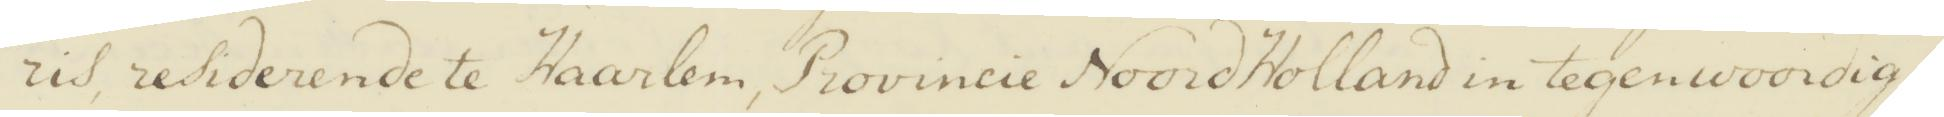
ris, residerende te Haarlem, Provincie Noord Holland in tegenwoordig-
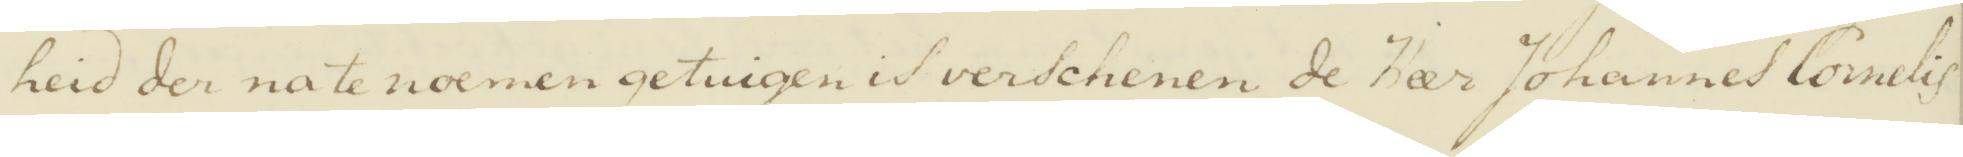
heid der na te noemen getuigen is verschenen de Heer Johannes Cornelis
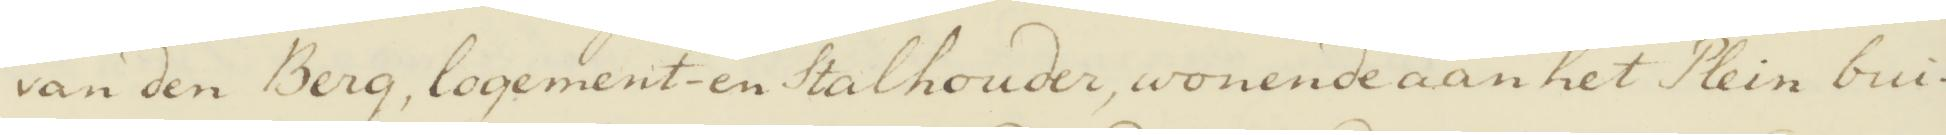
van den Berg, logement-en stalhouder, wonende aan het Plein bui-
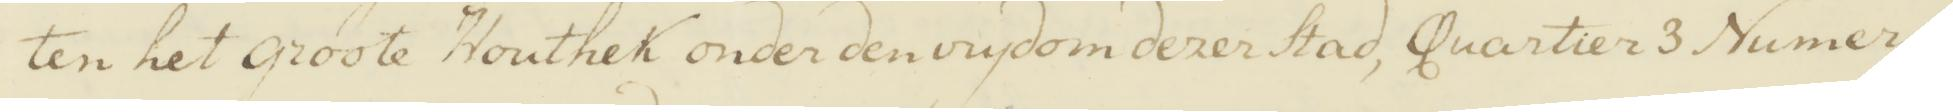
ten het groote Houthek onder den vrydom dezer stad, Quartier 3 Numero
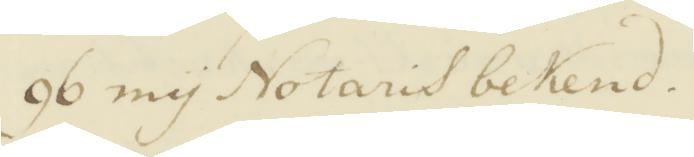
96 mij Notaris bekend.
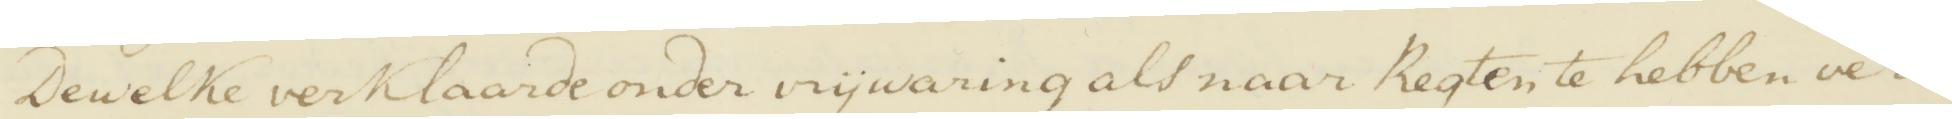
Dewelke verklaarde onder vrijwaring als naar Regten te hebben ver-
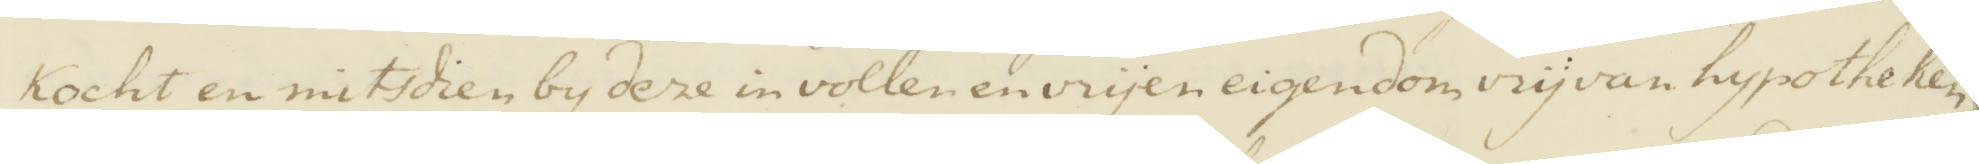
kocht en mitsdien by deze in vollen en vrijen eigendom vrij van hypotheken
